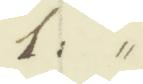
1: „
